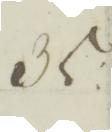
35:
